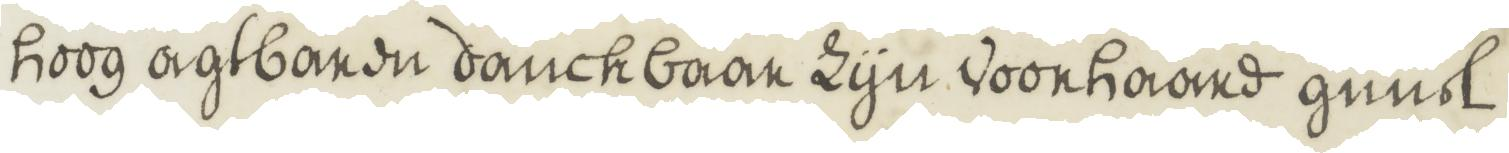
hoog agtbaren danckbaar zijn voorhaare gunst
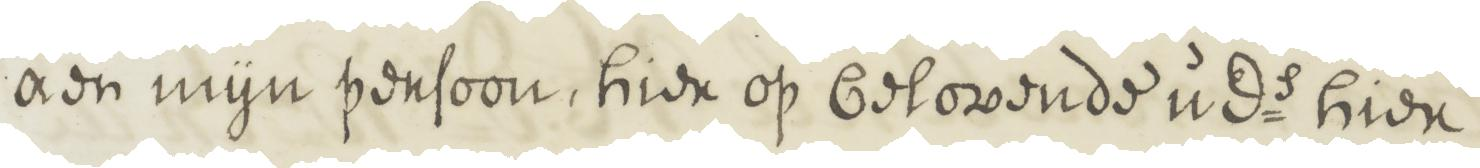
aen mijn persoon, hier op belovende u E=s hier
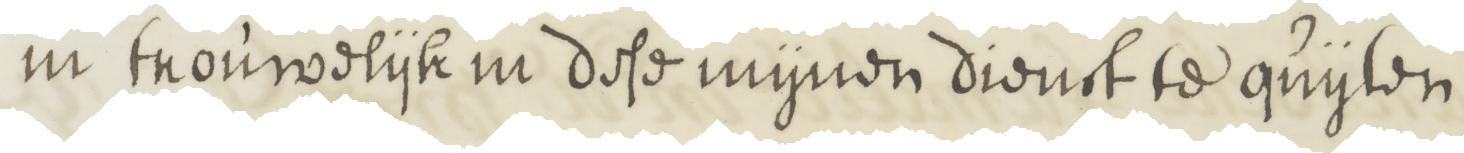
in trouwelijk in dese mijnen dienst te quijten
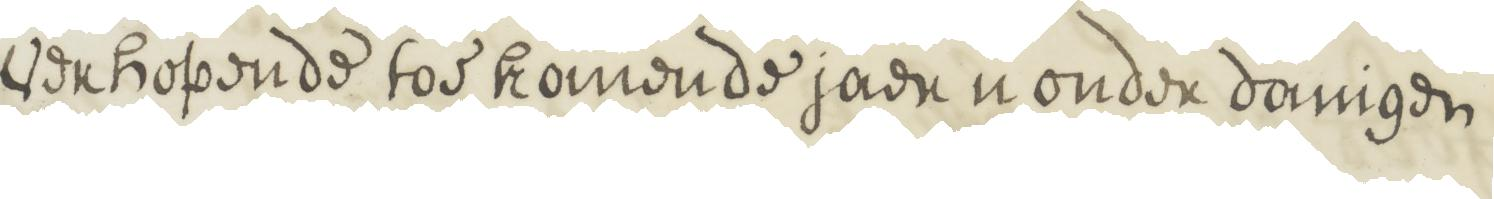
verhopende toe komende jaer u onder danigen
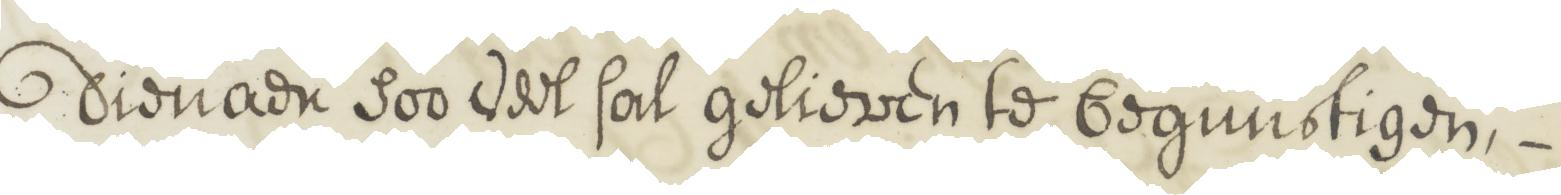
dienaer soo veel sal gelieven te begunstigen, —
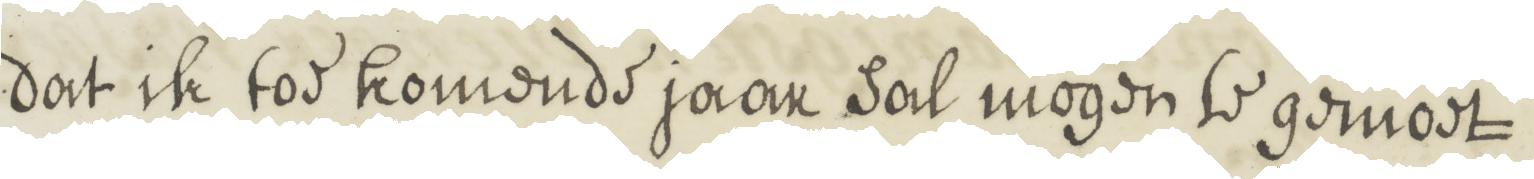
dat ik toe komende jaar sal mogen te gemoet
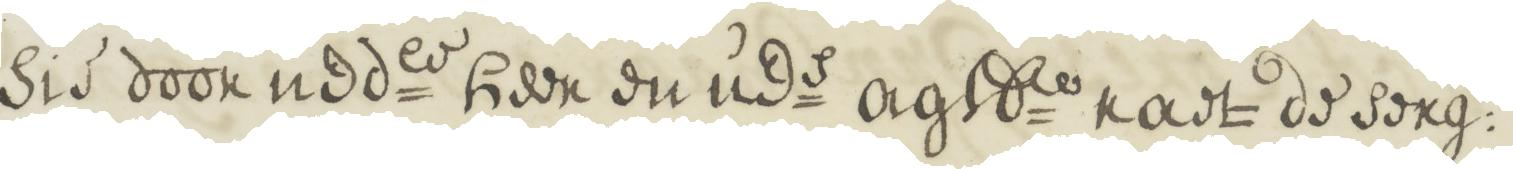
sie door uEd=le heer en uE=s agtb=e raet de serg:t
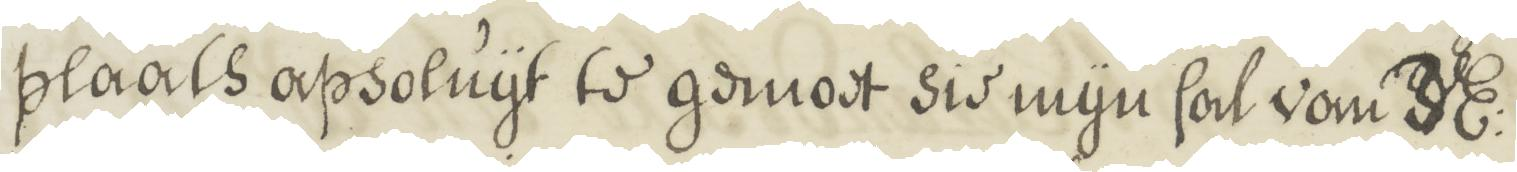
plaats apsoluijt te gemoet sie mijn sal van VE:
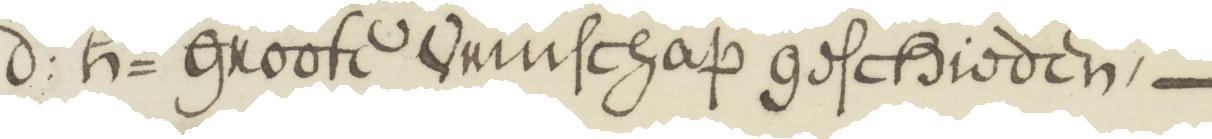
d:le h=r groote vrinschap geschieden/ —
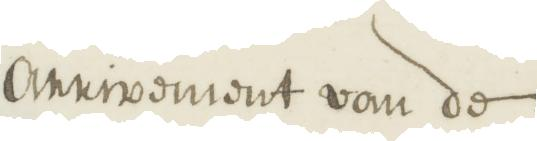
Arrivement van de
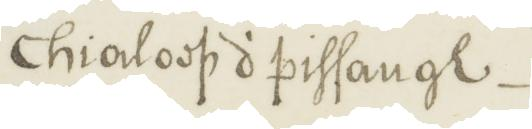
chialoep d’ pissangh —
